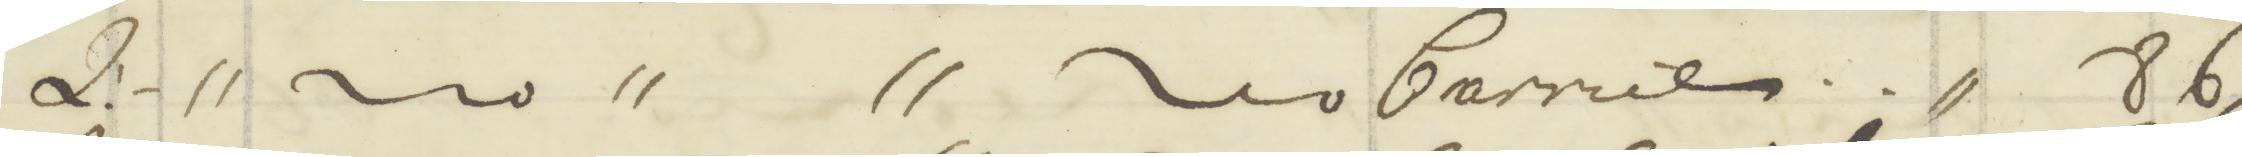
2:– „ _o „ „ _o„ barril . . „ 8 6
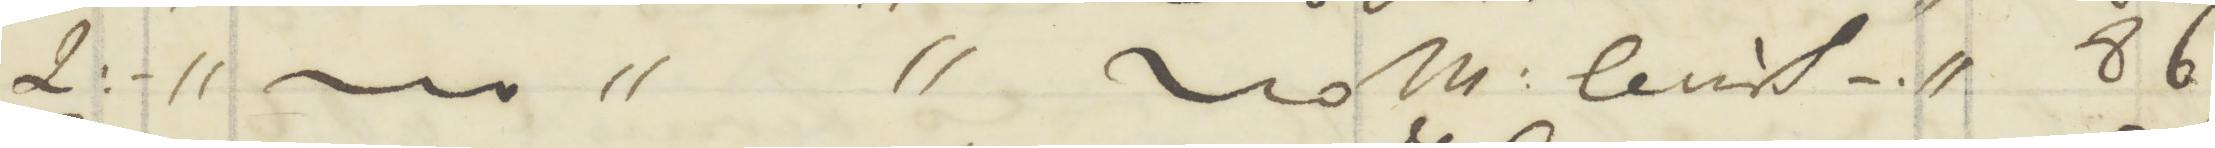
2:- „ _o „ „ _o M: leurs - . „ 8 6
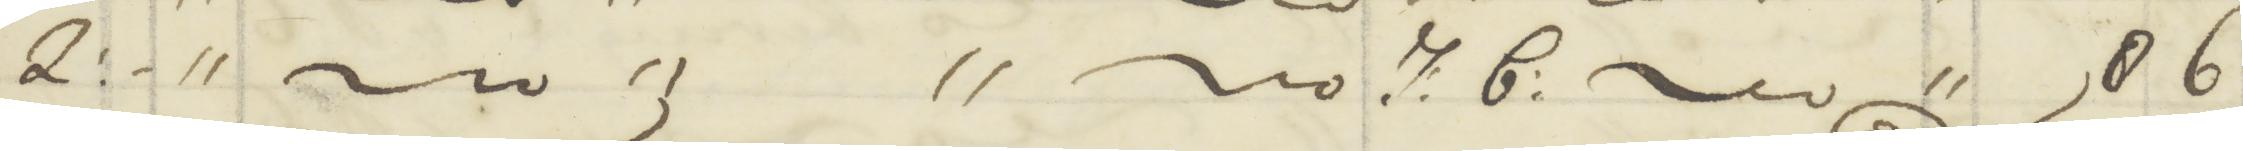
2:- „ _o „ „ _o „ I B: _o „ 8 6
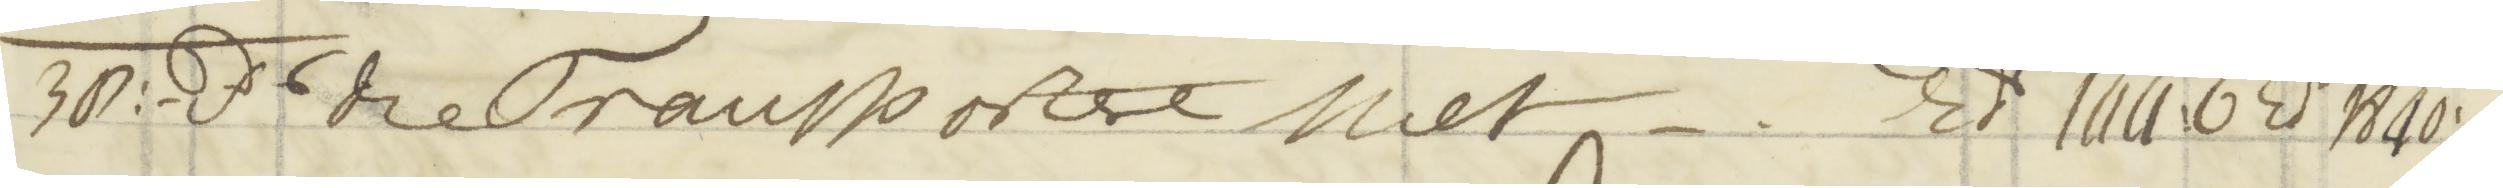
38:- Ps die Transportere met - - - rds 144:6 rds 1840:
